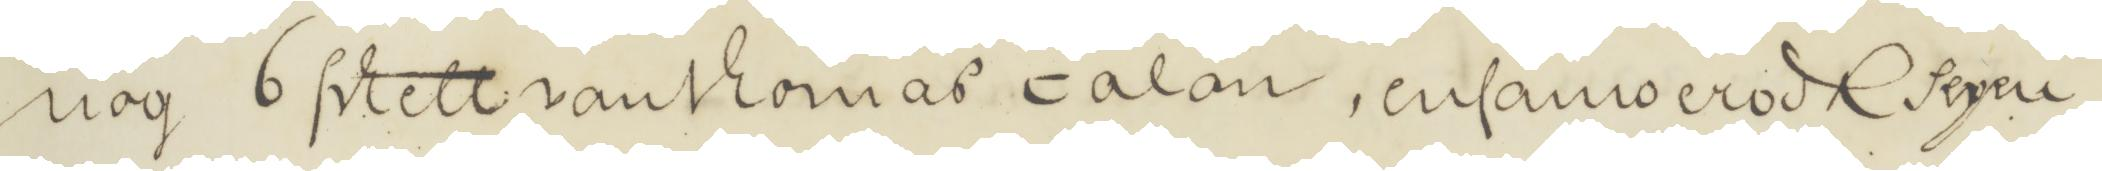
nog 6 schell: van thomas calan, ensamoeroek seyen
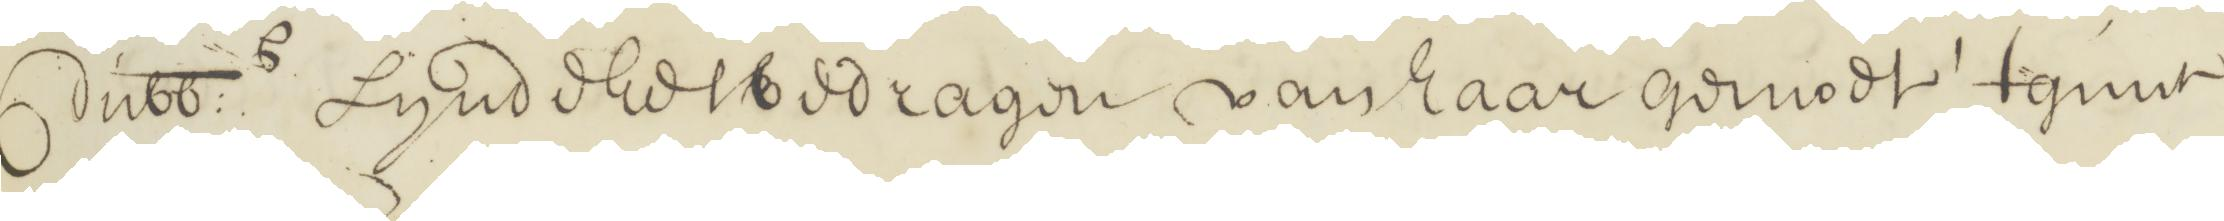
dubb:b zyndehetbedragen van haar gemoet 'tgunt
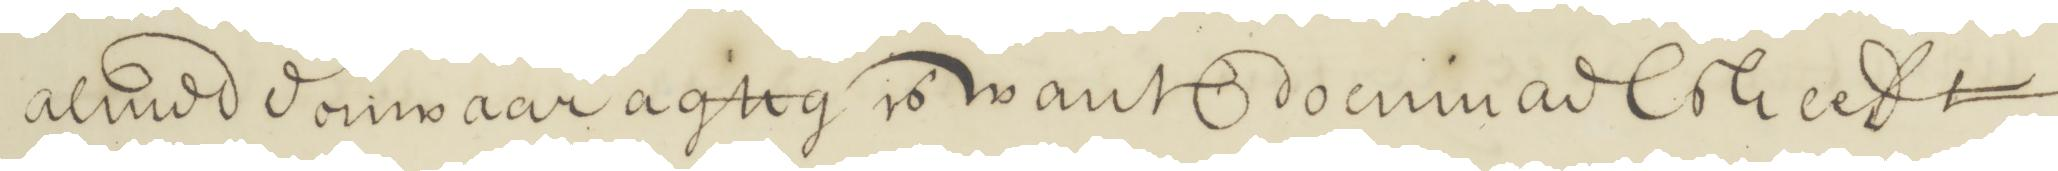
almed e onwaar agtig is want doeninaelsheeft
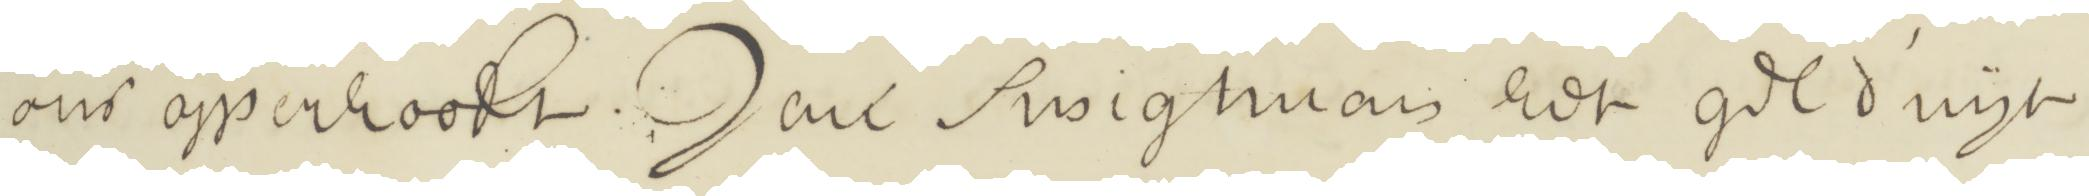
ons opperhooft. Jan swigtman het geld uijt
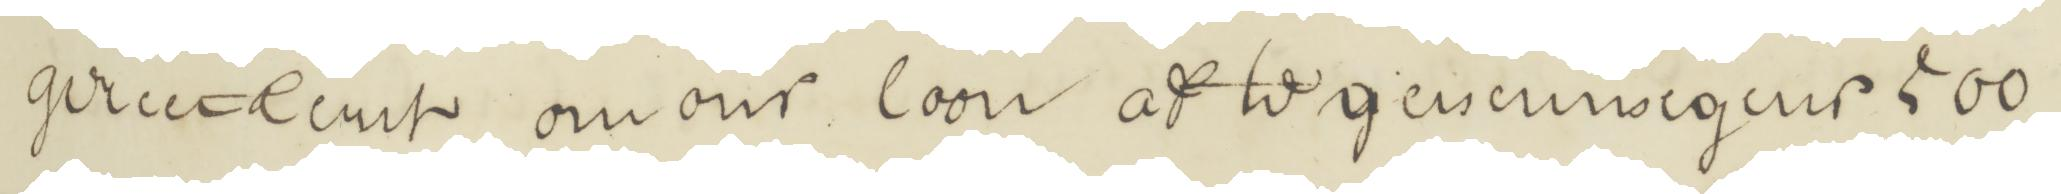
gereeckent om ons loon af te gevenwegens 500
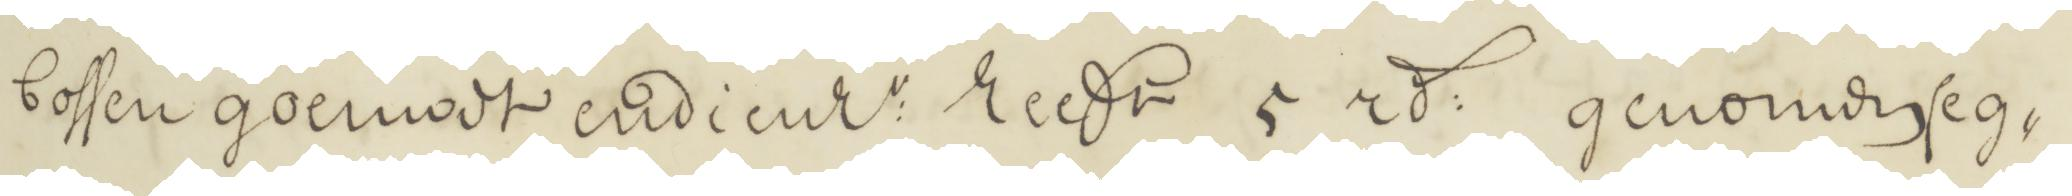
bossen goenwet endienh:r heeft 5 rd:s genomen seg„
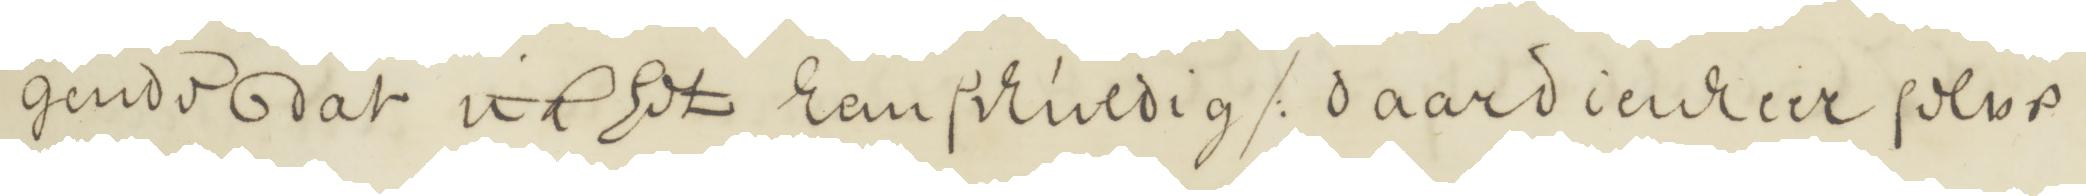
gende dat ick het hanschuldig /: daardienheer selvs
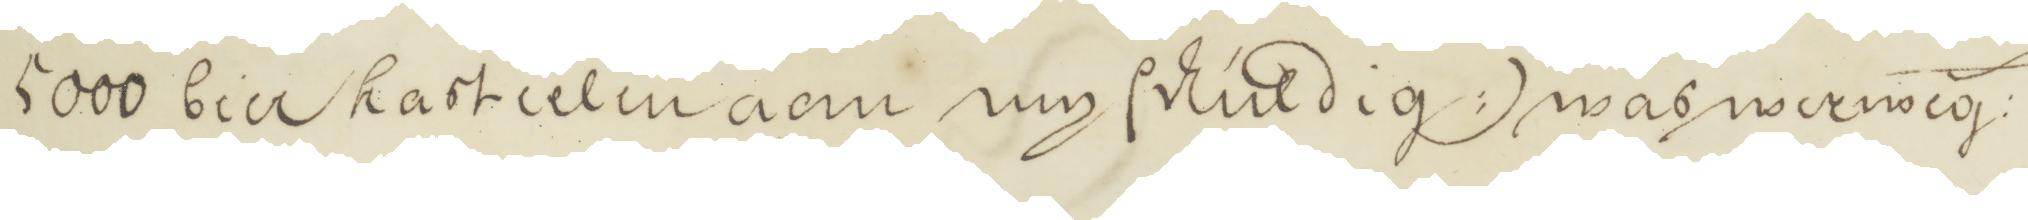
5000 bier kasteelen aan my schuldig:) was werweg:
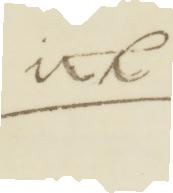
ick
